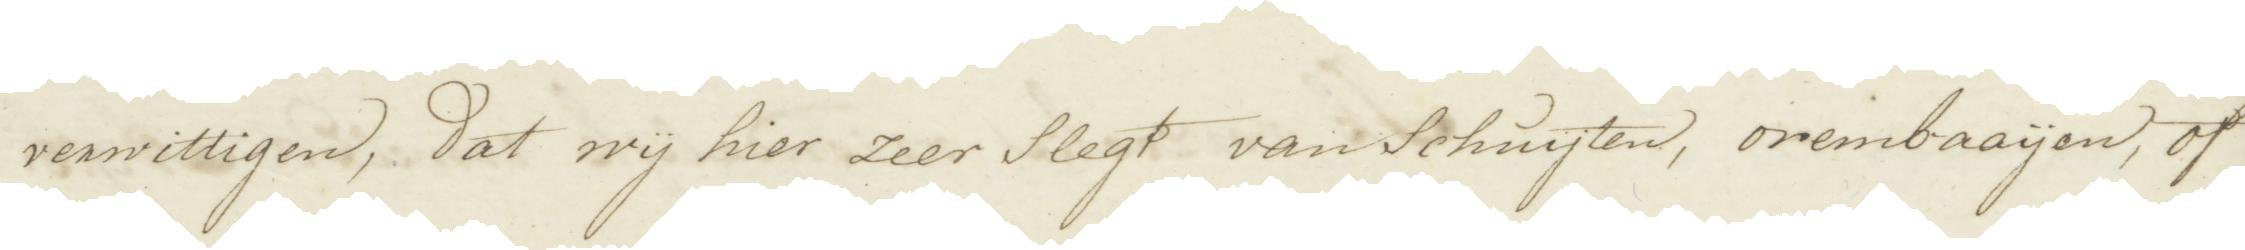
verwittigen, dat wij hier zeer slegt van schuijten, orembaaijen, of
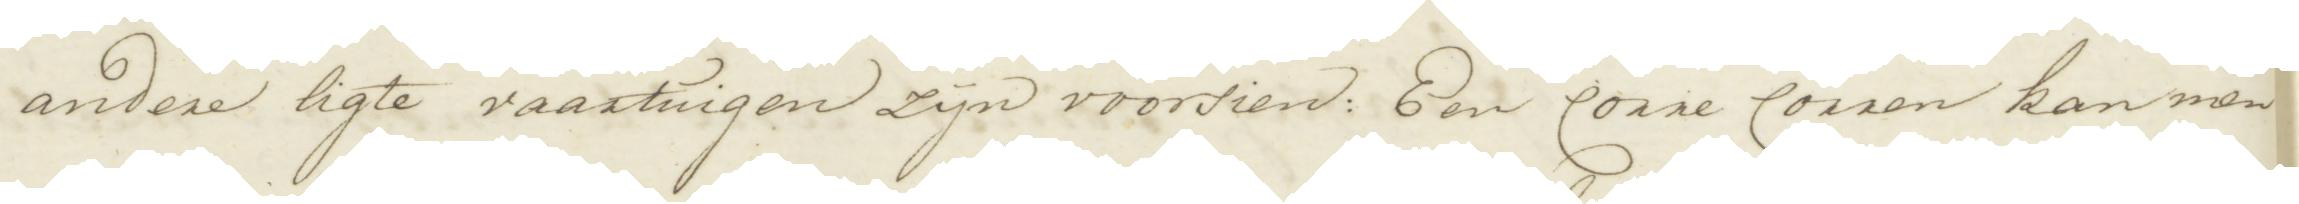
andere ligte vaartuigen zijn voorsien: Een Corre Corren kan men
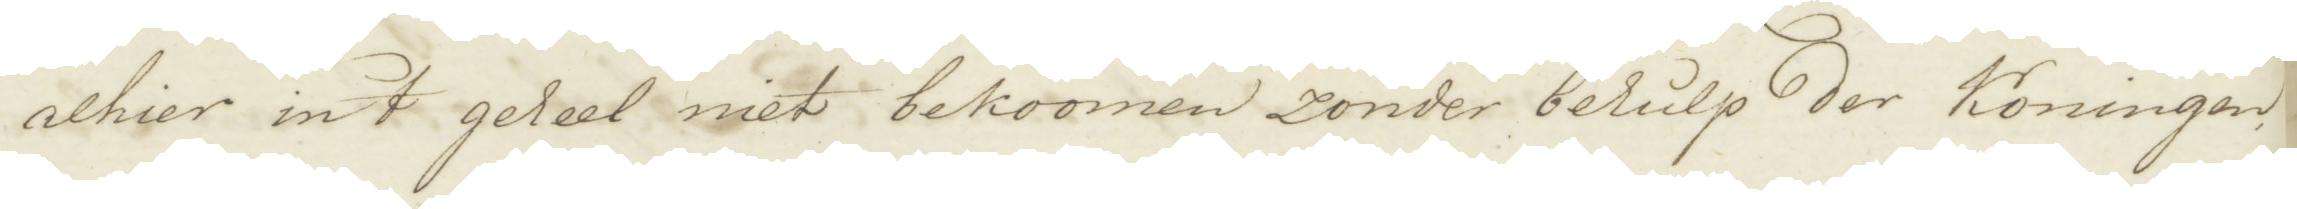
alhier in ’t geheel niet bekoomen zonder behulp der Koningen
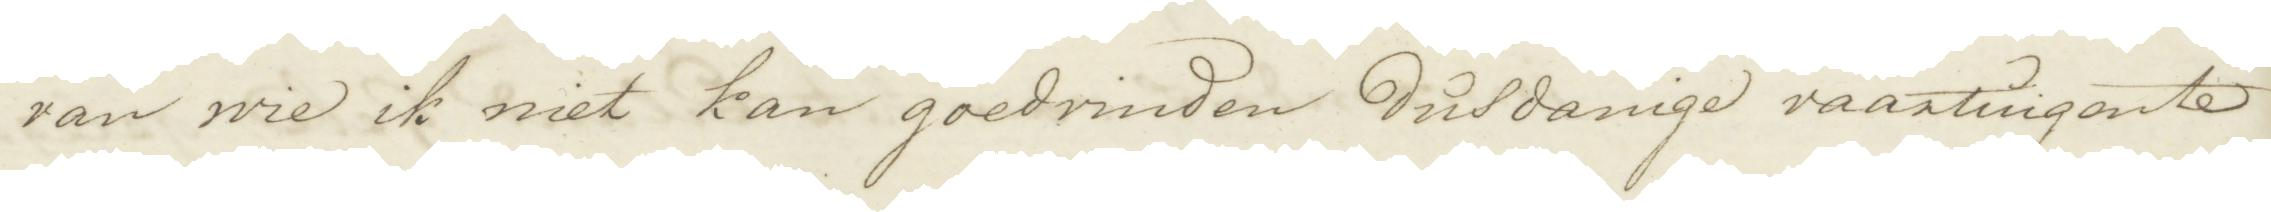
van wie ik niet kan goedvinden dusdanige vaartuigente
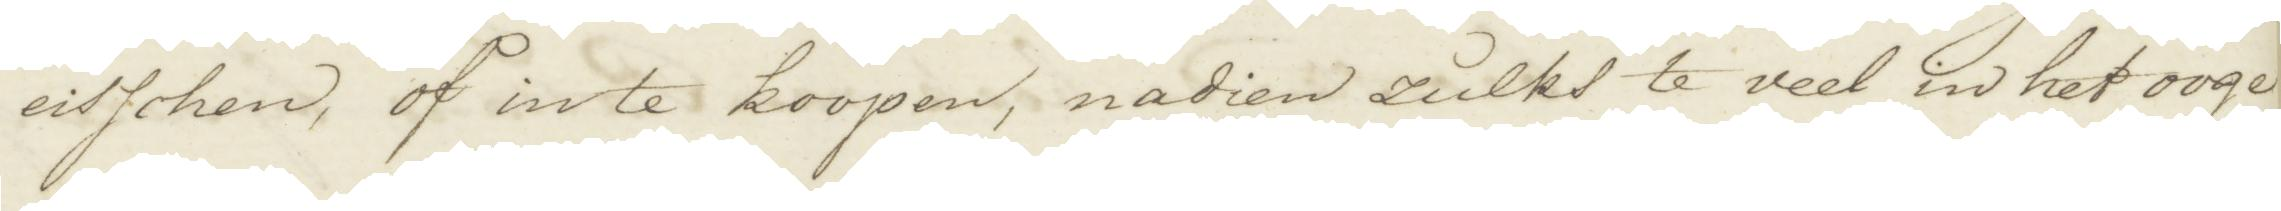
eisschen, of in te koopen, nadien zulks te veel in het ooge
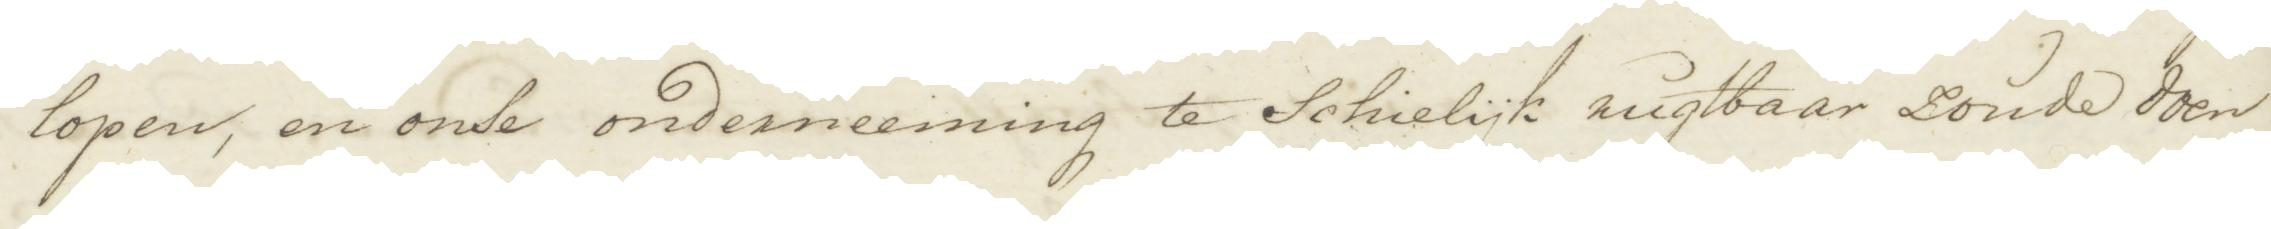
lopen, en onse onderneeining te schielijk rugtbaar zoude doen
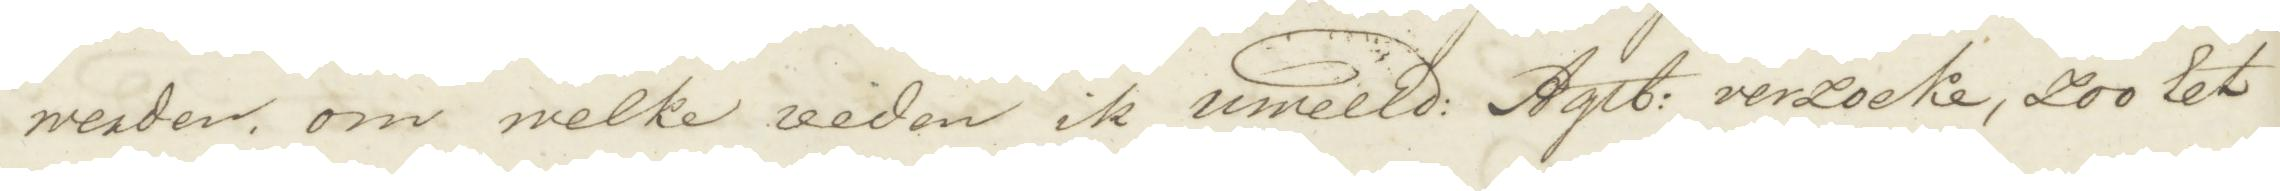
werden, om welke reeden ik uwelEd: Agtb: verzoeke, zoo het
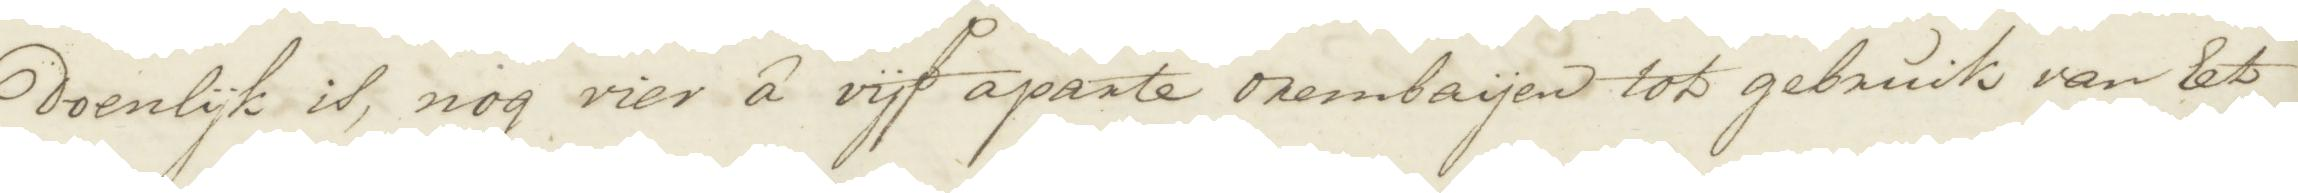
doenlijk is, nog vier â vijf aparte orembaijen tot gebruik van het
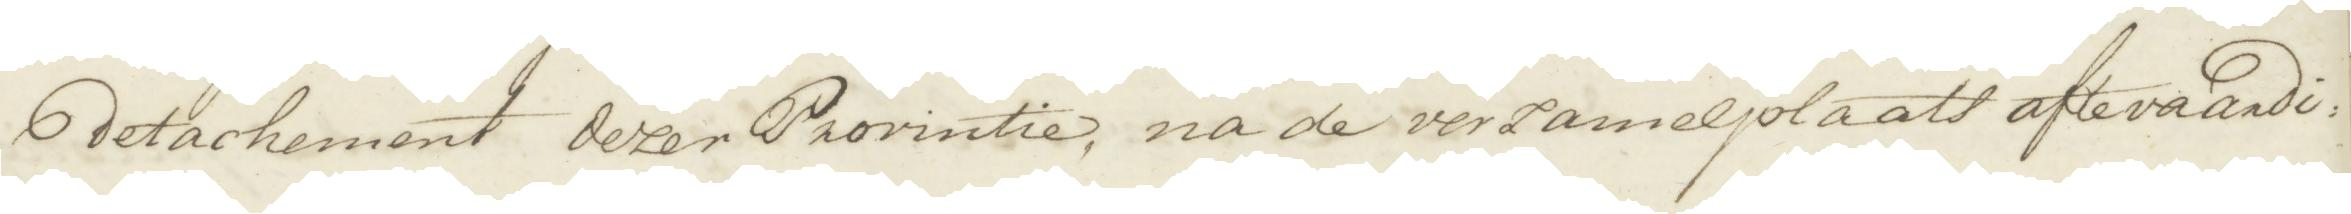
detachement dezer Provintie, na de verzamelplaats aftevaardi„
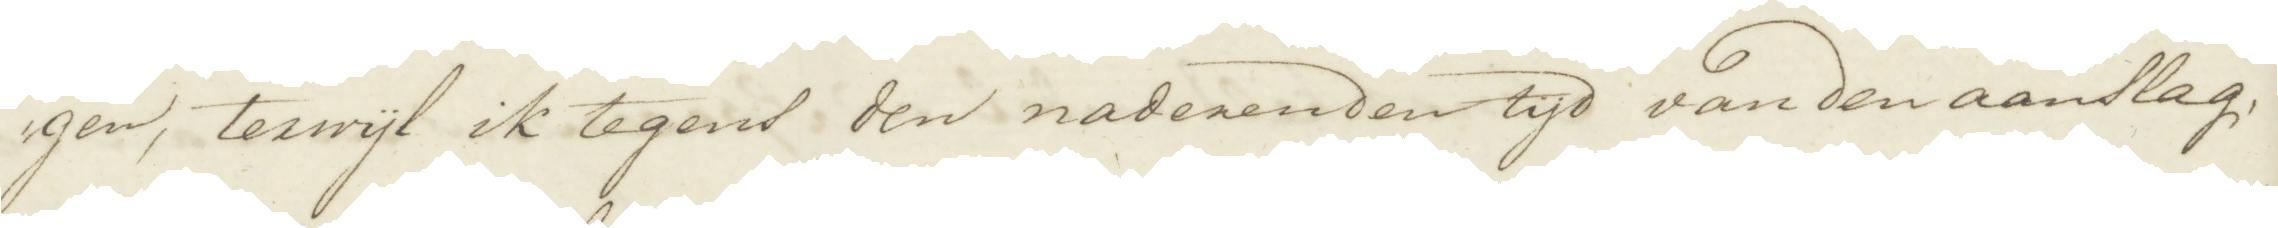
„gen, terwijl ik tegens den naderenden tijd van den aanslag„
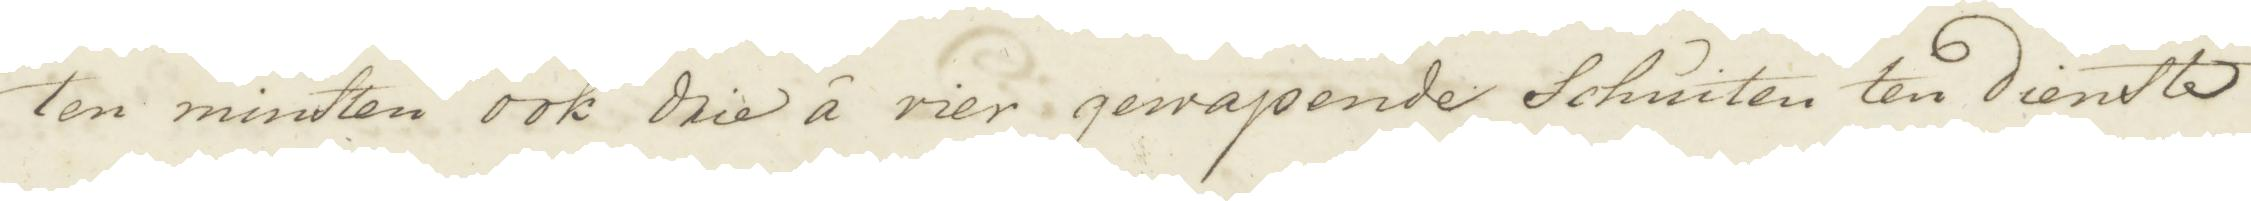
ten minsten ook drie â vier gewapende schuiten ten dienste
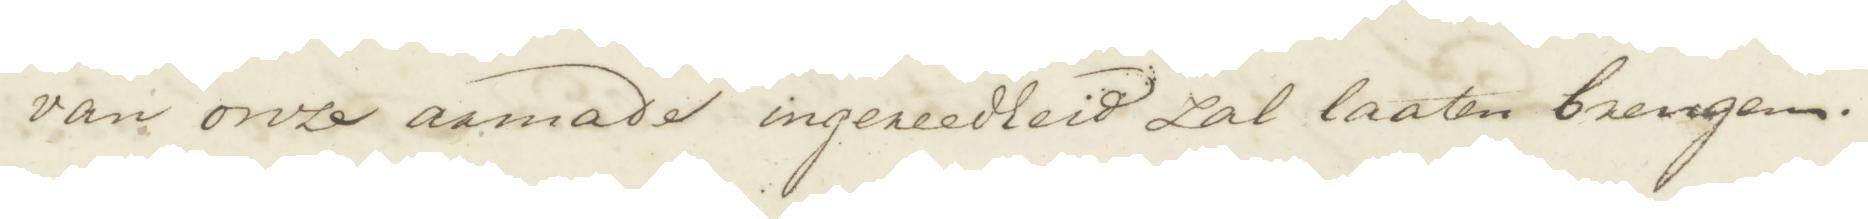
van onze armade ingereedheid zal laaten brengen.
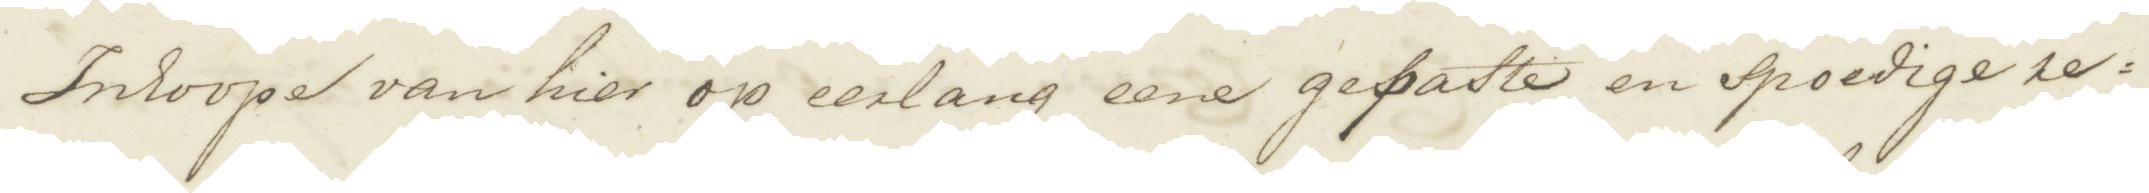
Inhoope van hier op eerlang eene gepaste en spoedige re=
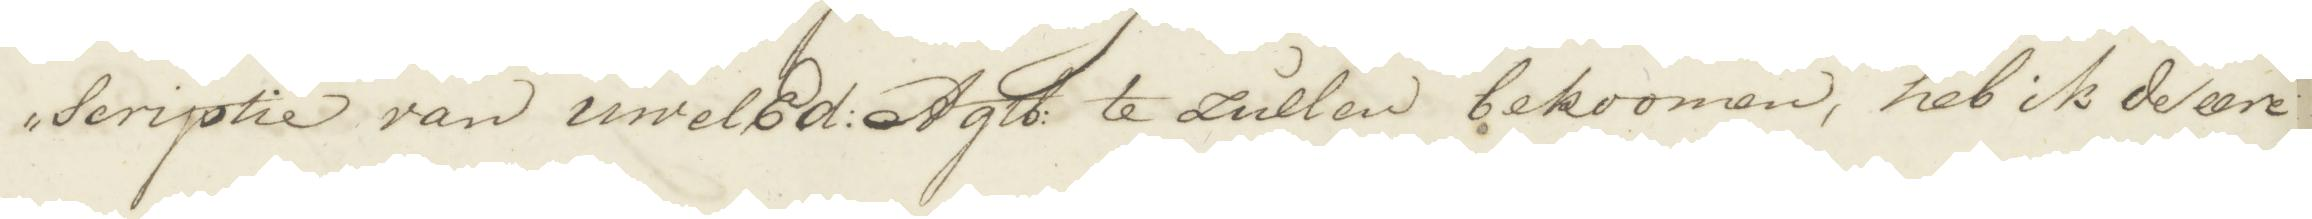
„seriptie van uwel Ed: Agtb: te zullen bekoomen, heb ik de eere
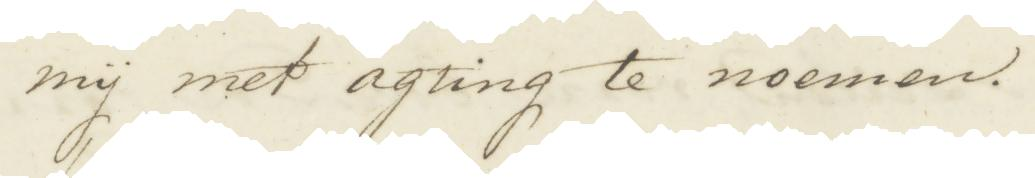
mij met agting te noemen.
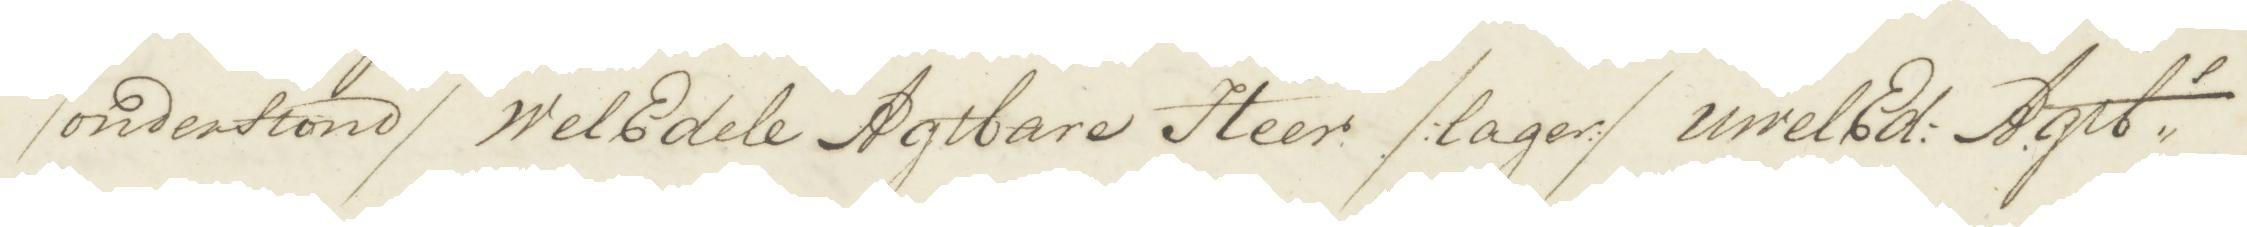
/onderstond/ Wel Edele Agtbare Heer /:lager/ uwel Ed: Agtb„s
